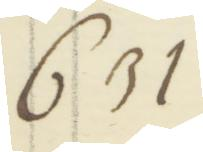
631
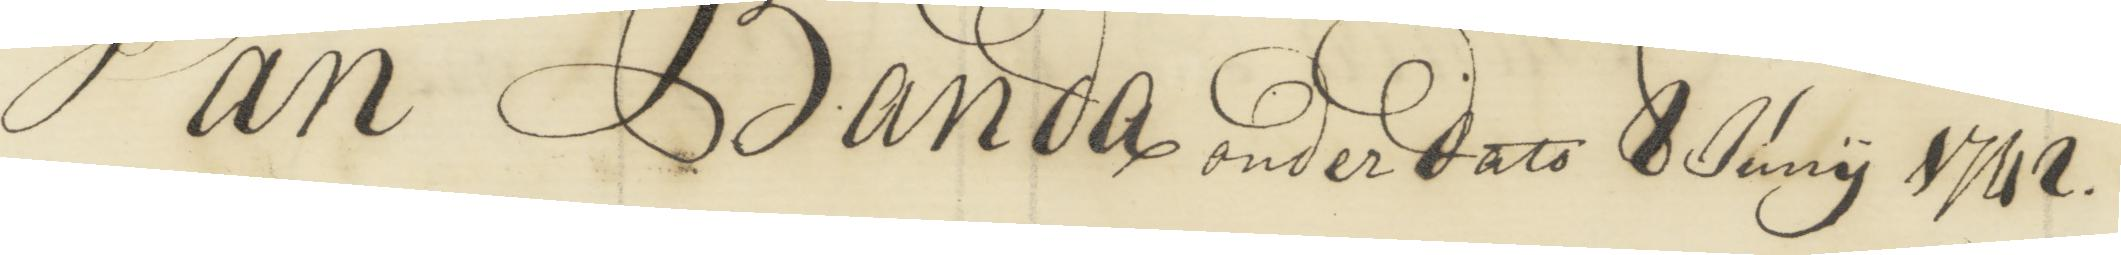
Van Banda onder dato 8 Iunij 1742.
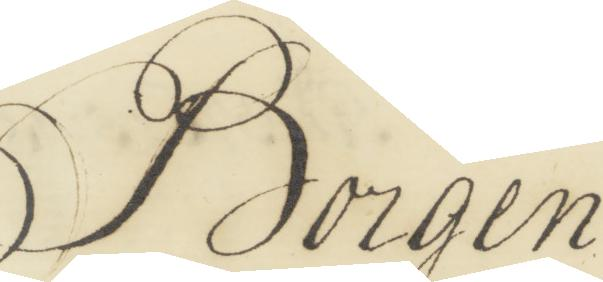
Borgen
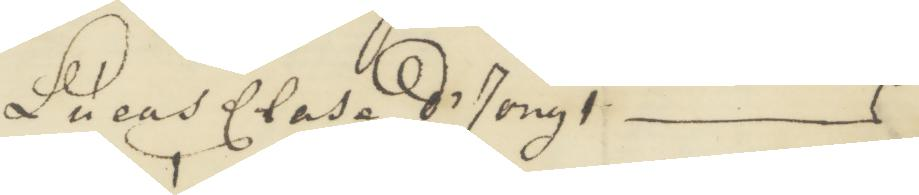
Lucas Clase d’ Jong 1 _o
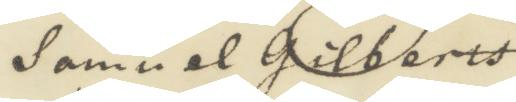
Samuel Gilberts
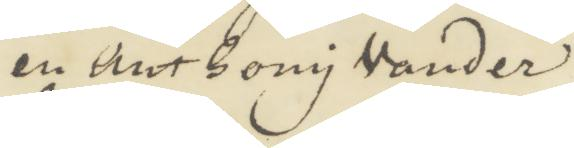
en anthonij Vander
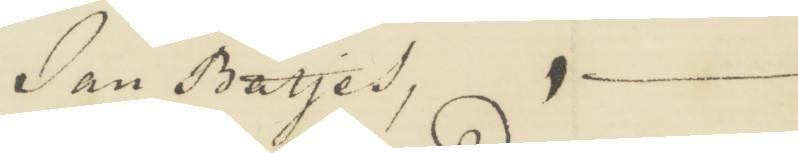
Ian Batjes, 1 —
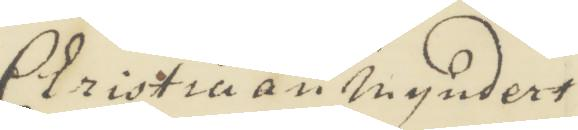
Christiaan mijndert
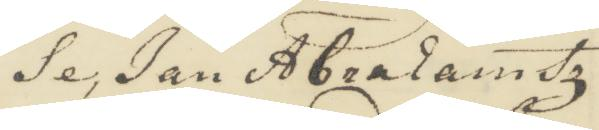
se, Ian Abrahamsz
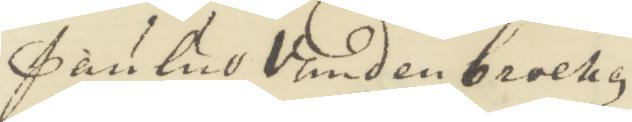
paulus Van den broeken
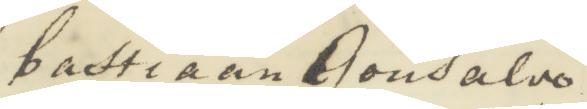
bastiaan Gousalvo
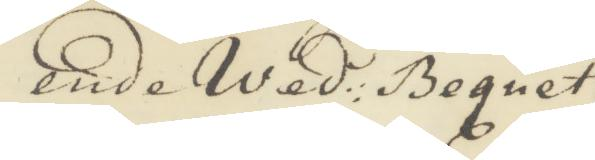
ende Wed: Bequet
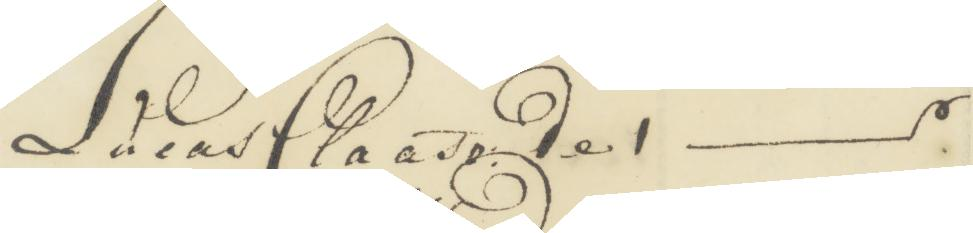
Lucas Claasz: de 1 _o
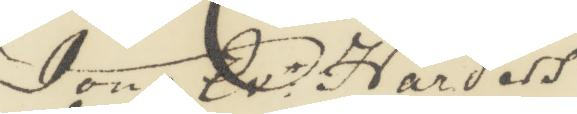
Jong, Ev:t Harders
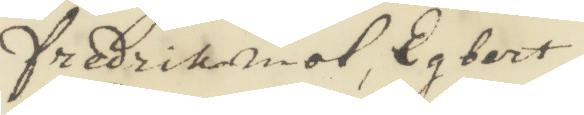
fredrik mol, Egbert
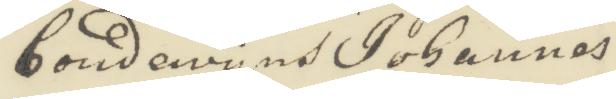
boudewijns Iohannes
